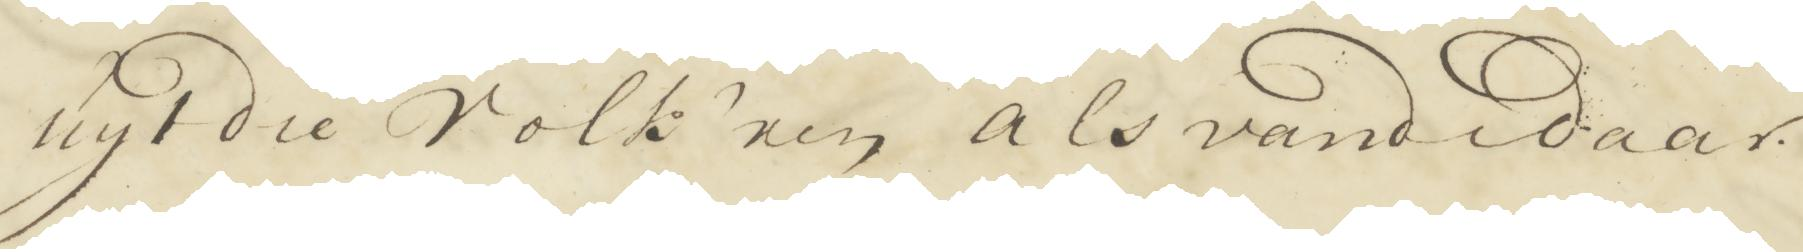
uyt die volk'ren als van de daar
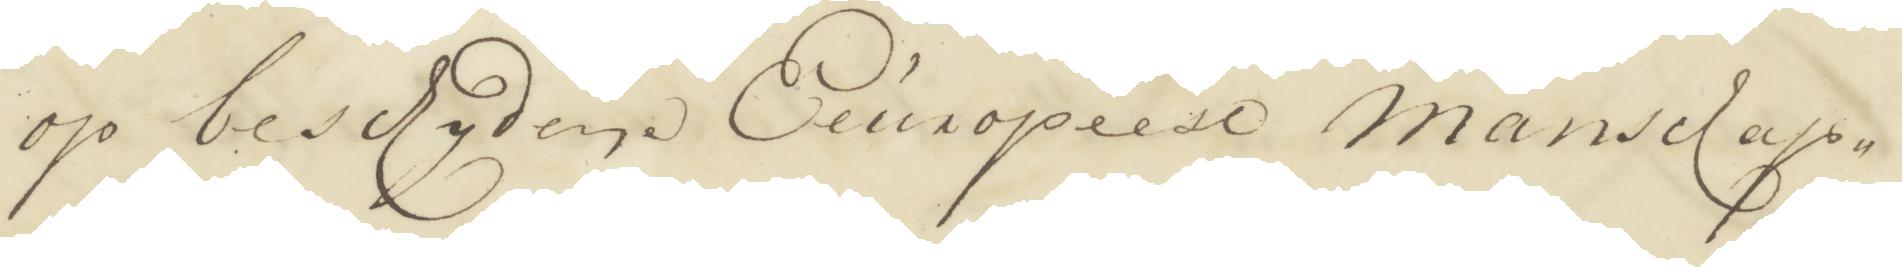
op beschyde Eeuropeese manschap„
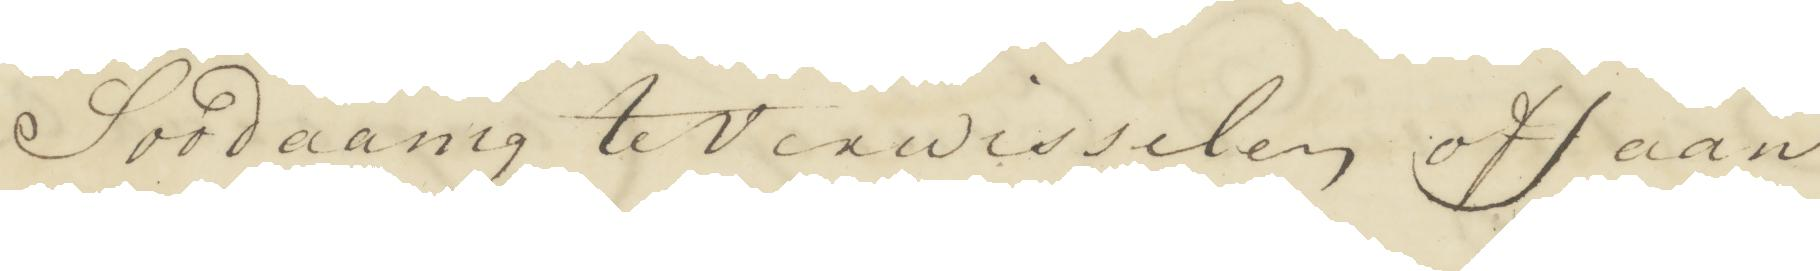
Soodaanig te verwisselen off aan
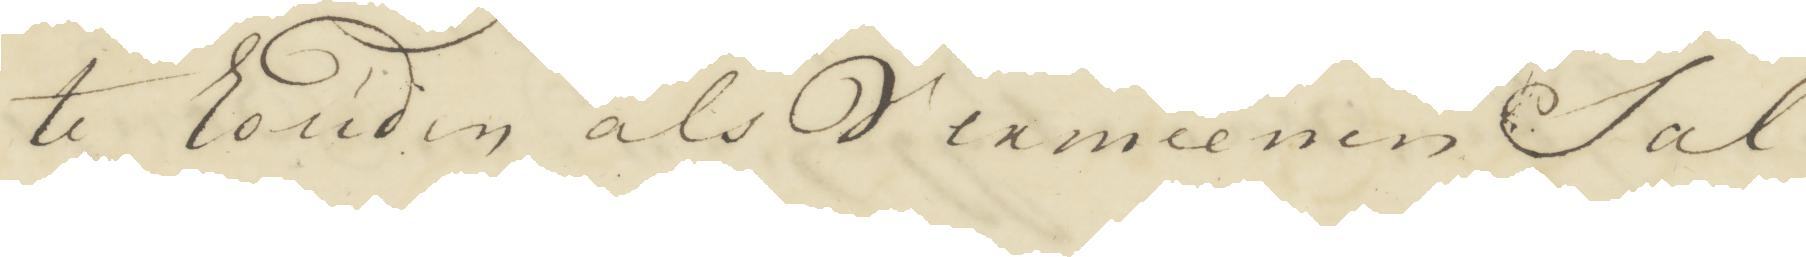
te houden als Vermeenen Sal
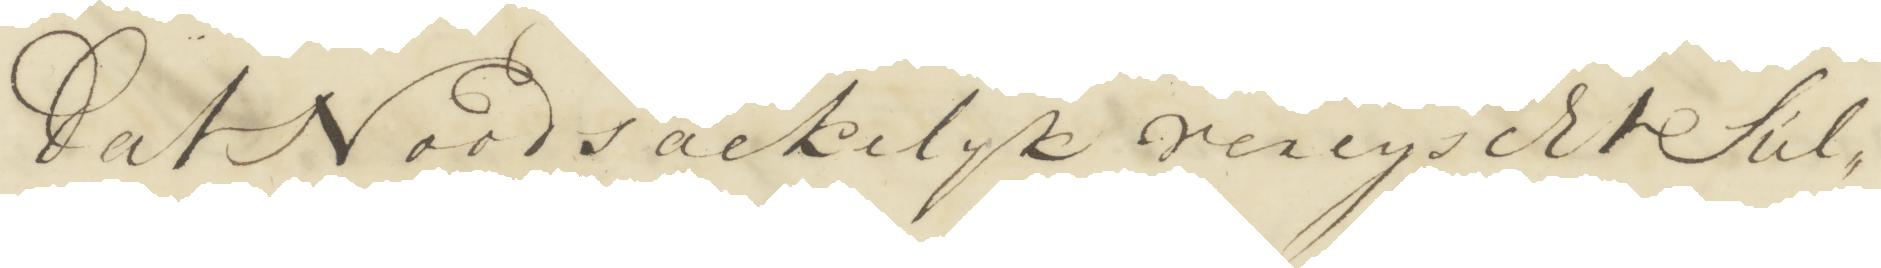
dat Noodsackelyk vereyscht Sul=
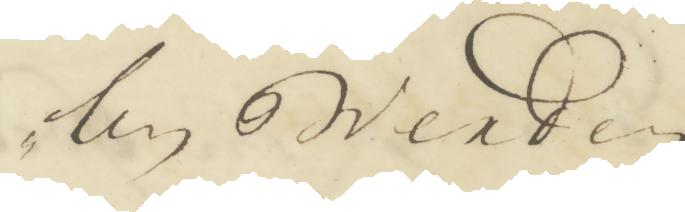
„len werden
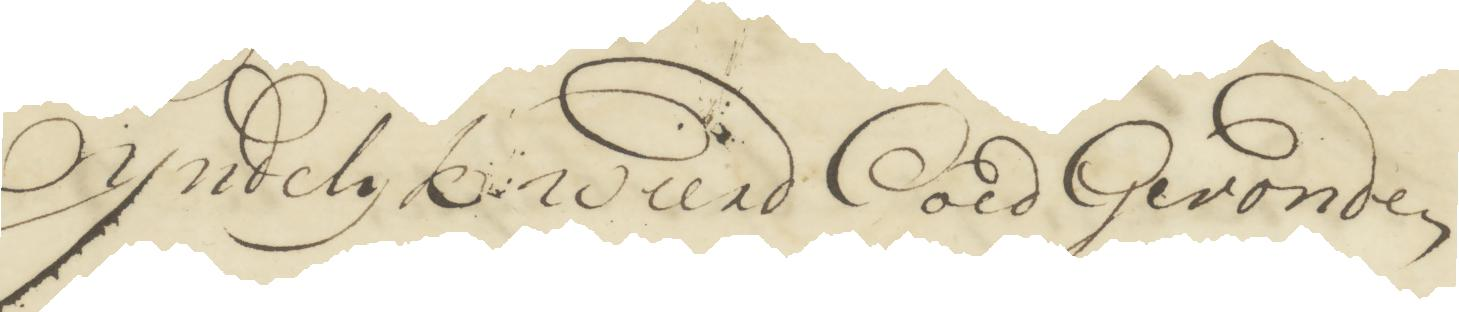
Eyndelyk wierd Goed gevonden
